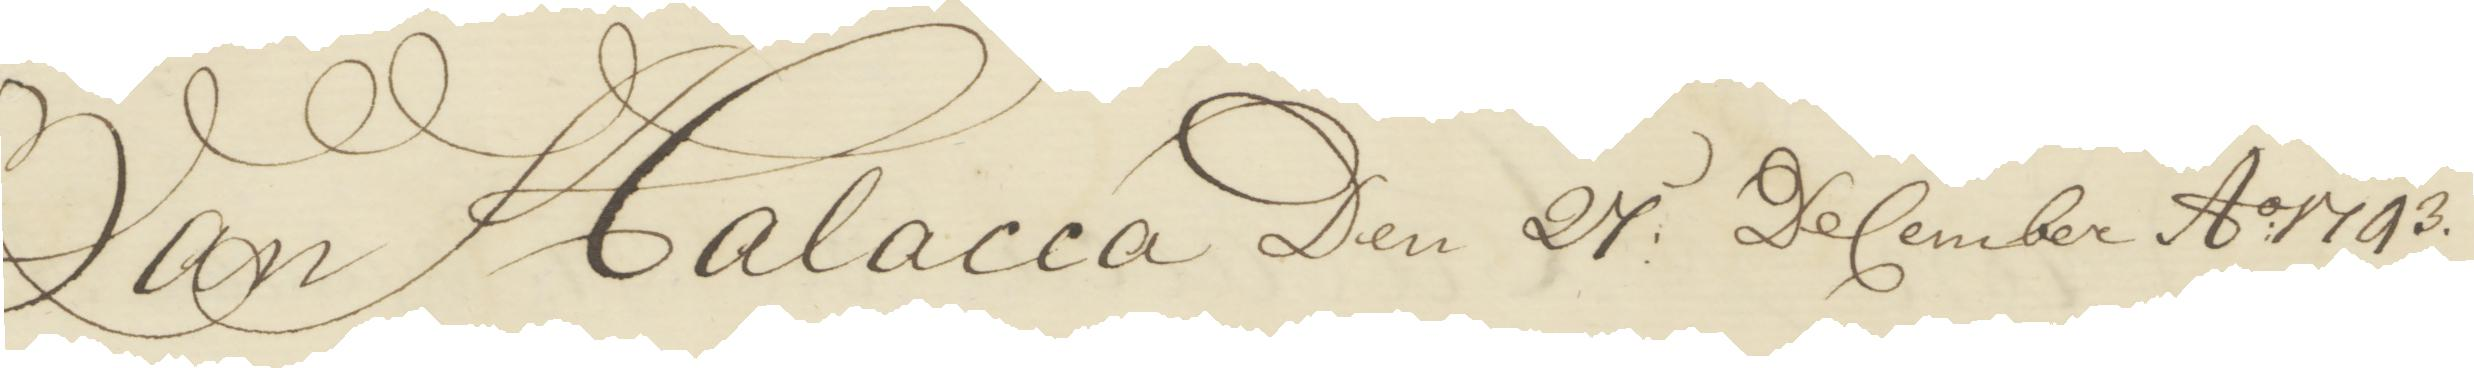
Van Malacca Den 27:' December A:o 1743.
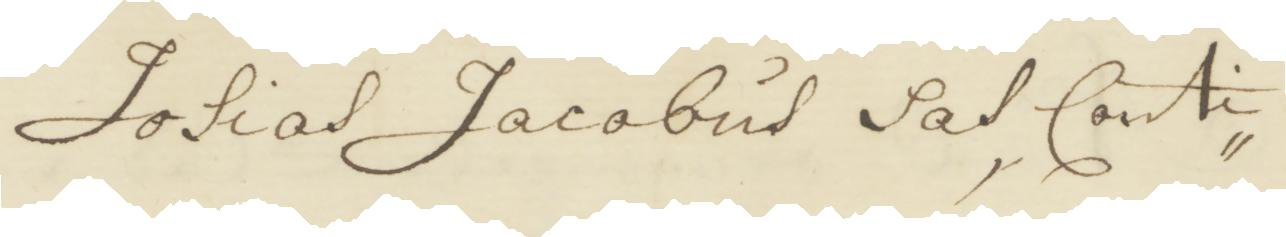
Josias Jacobus sas, conti„
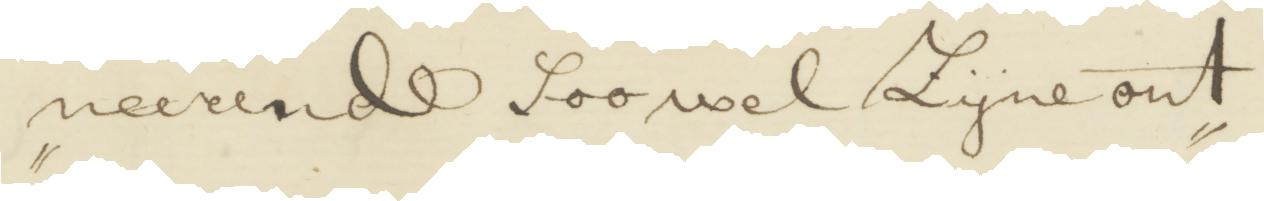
„neerende soo wel zijne ont„
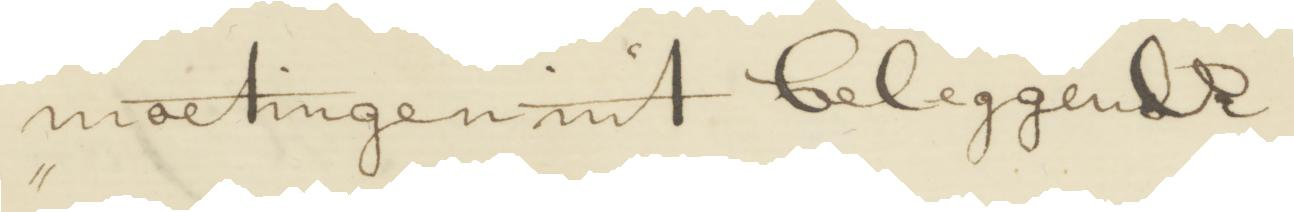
„moetingen in't beleggen der
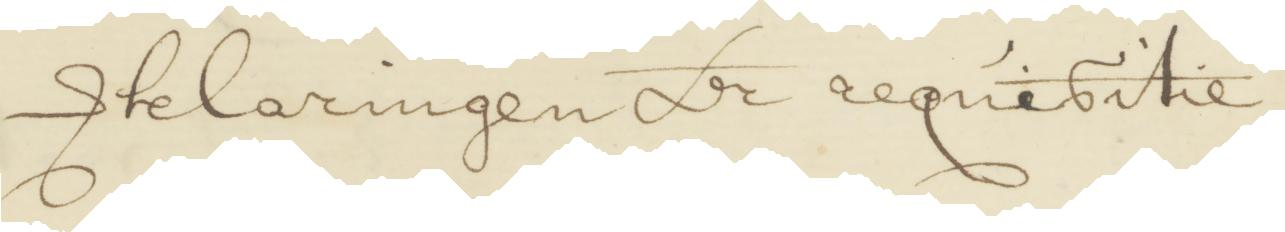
verklaringen ter requisitie
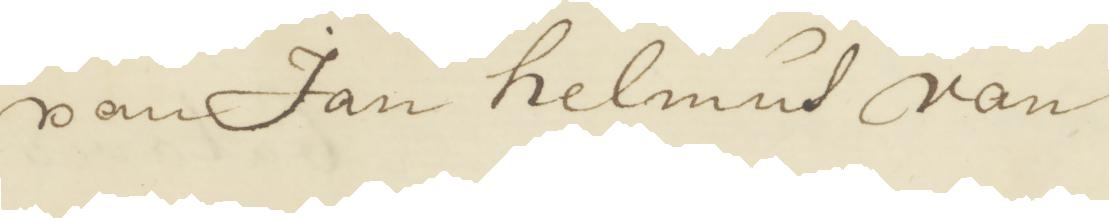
van Jan helmus van
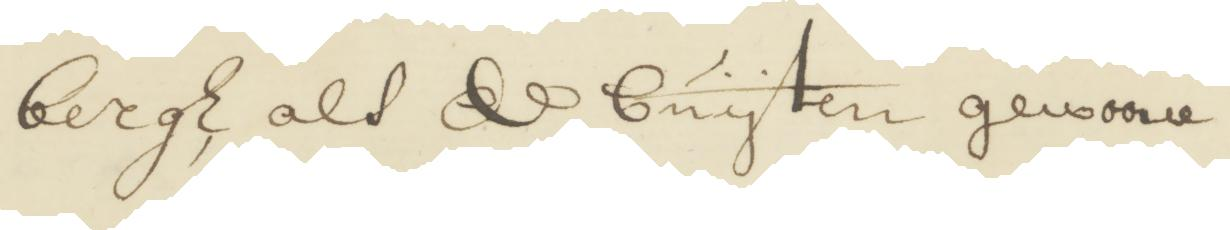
bergh, als de buijten gewoone
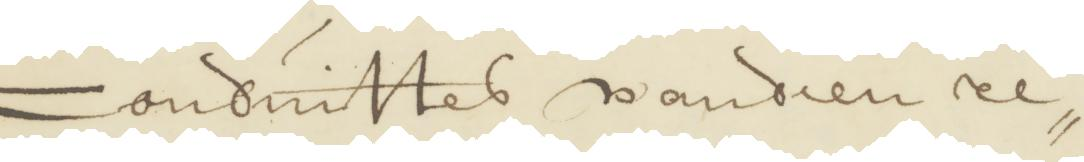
conduittes van dien re„
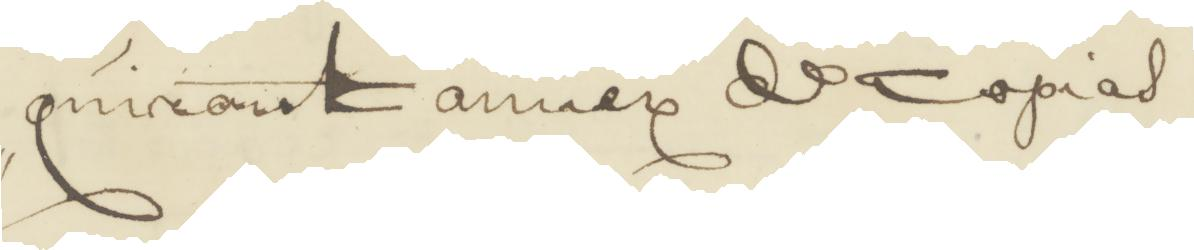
„quirant annex de copias
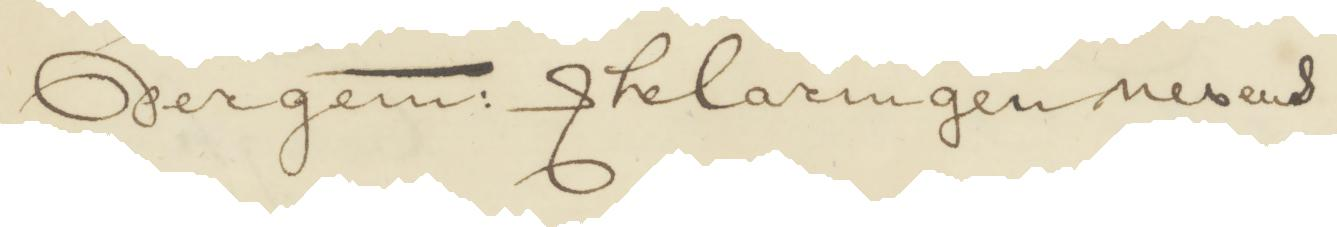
der gem: verklaringen nevens
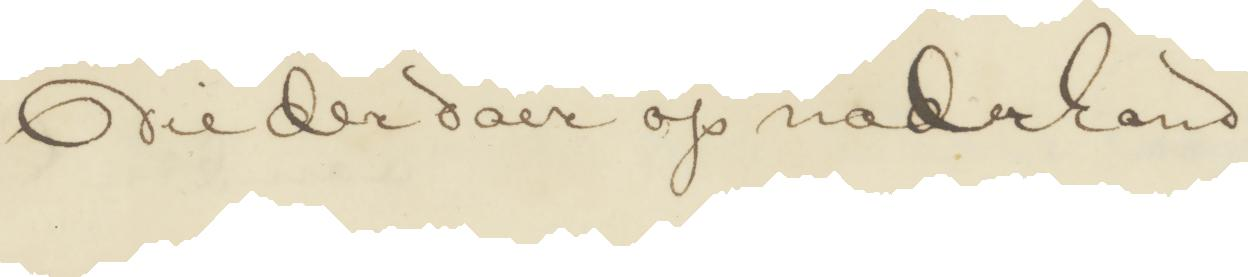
die der daer op naderhand
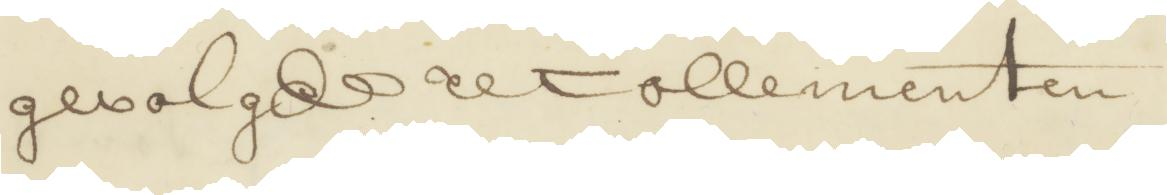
gevolgde recollementen
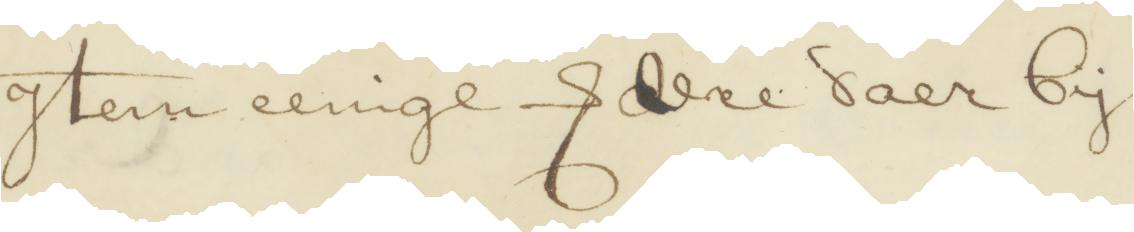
Jtem eenige verdere daer bij
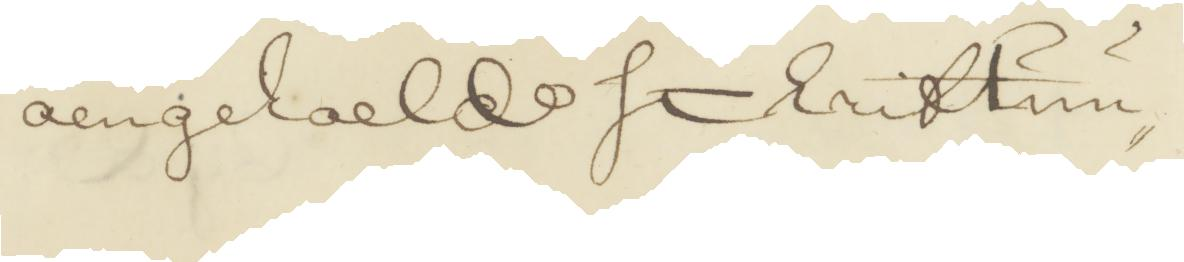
aengehaelde schriftuu„
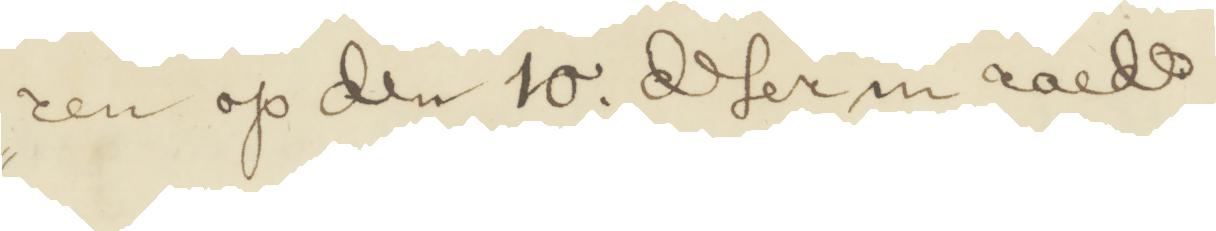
„ren op den 10. deser in raede
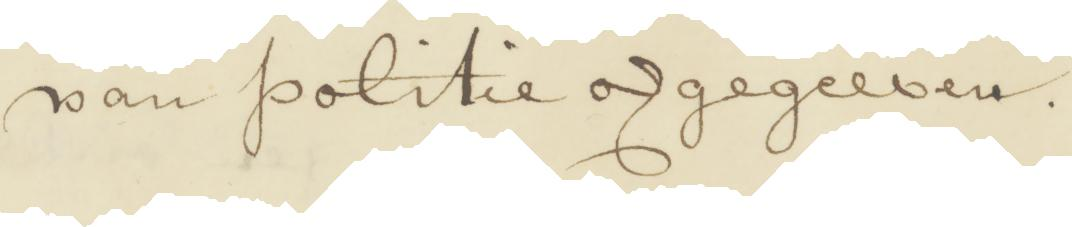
van politie overgegeeven.
